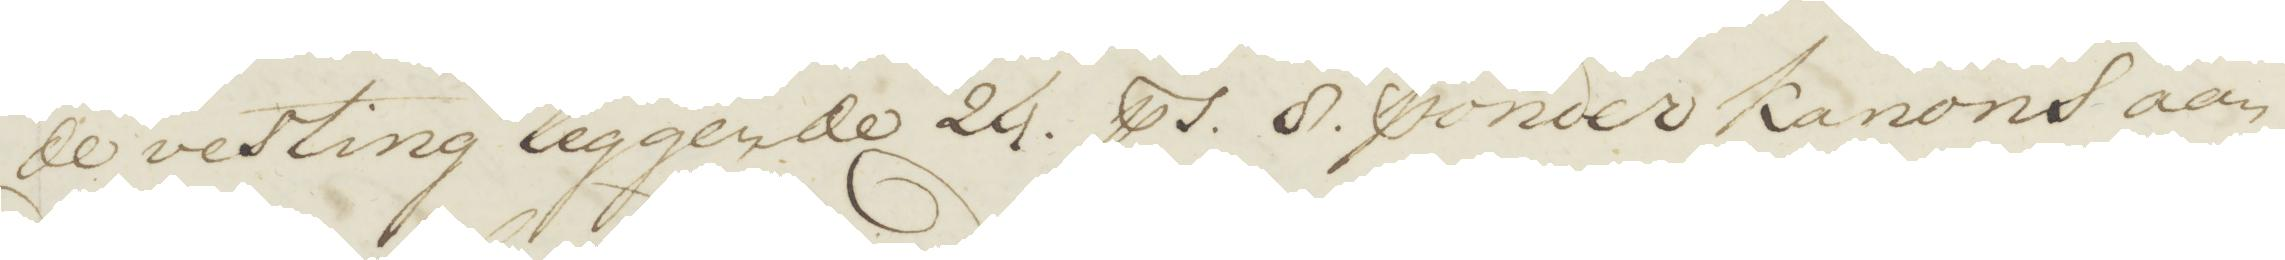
de vesting leggende 24. ps. 8. ponder Kanons aan
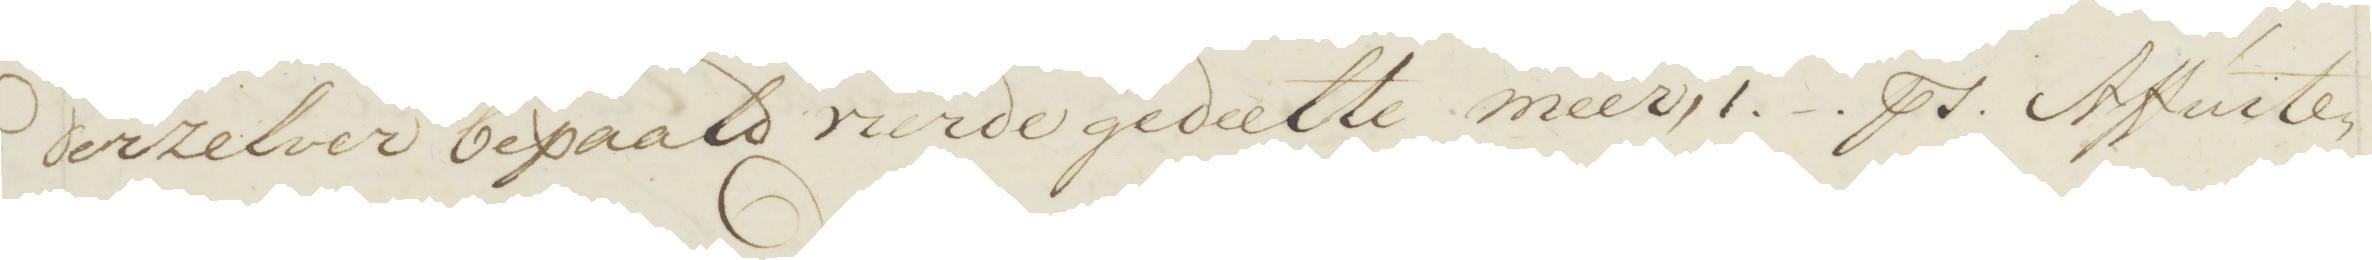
derzelver bepaald vierde gedeelte meer,1.–. ps. Affuiten
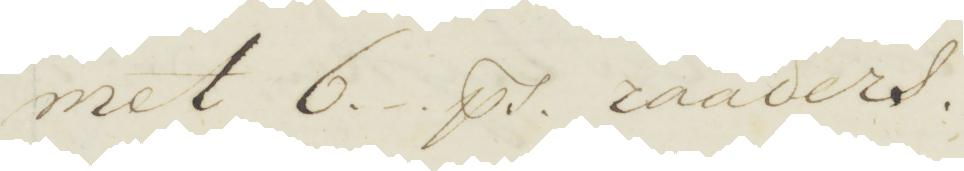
met 6.–. ps. raaders.
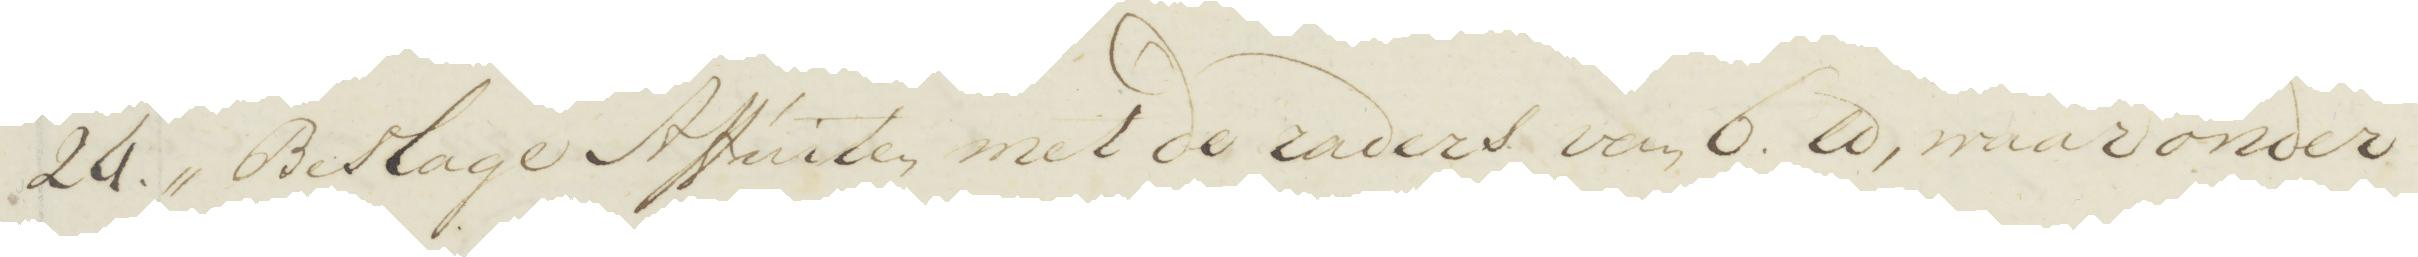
24. „ Beslage Affuiten met de raders van 6. ld, waar onder
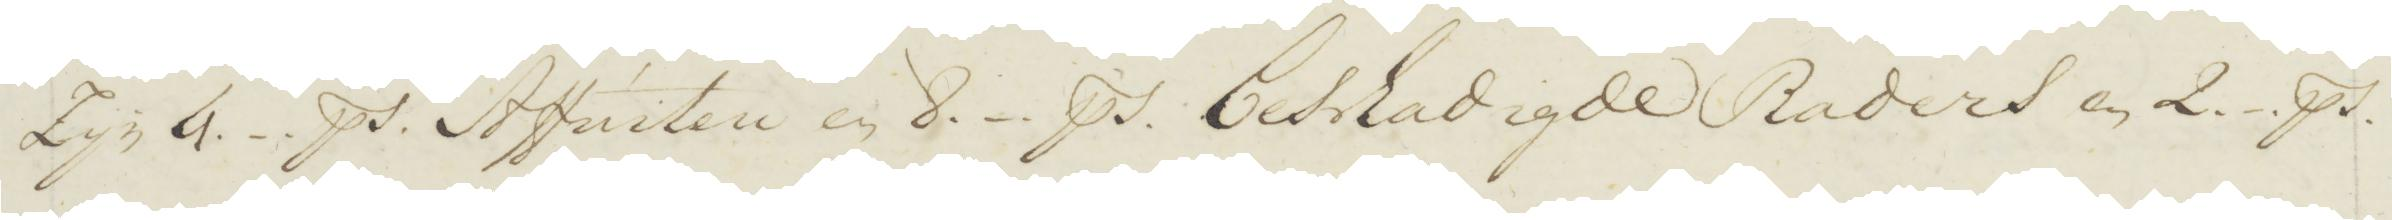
zijn 4._. ps. Affuiten en 8.–. ps. beschadigde Raders en 2.–. ps
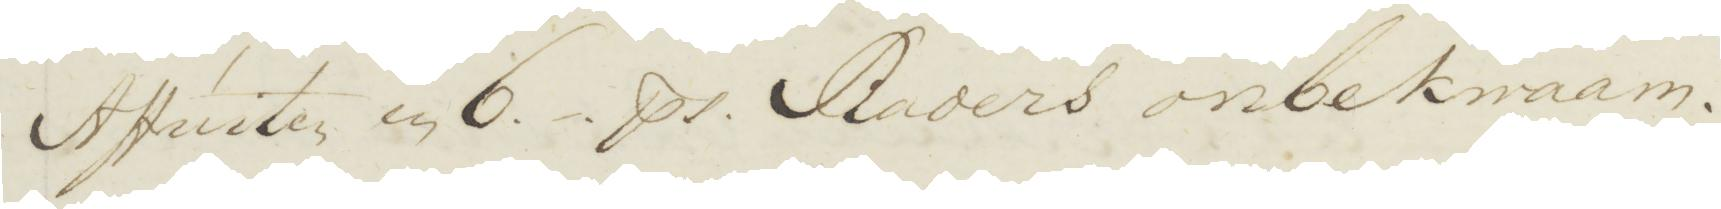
Affuiten en 6.– ps. Raders onbekwaam.
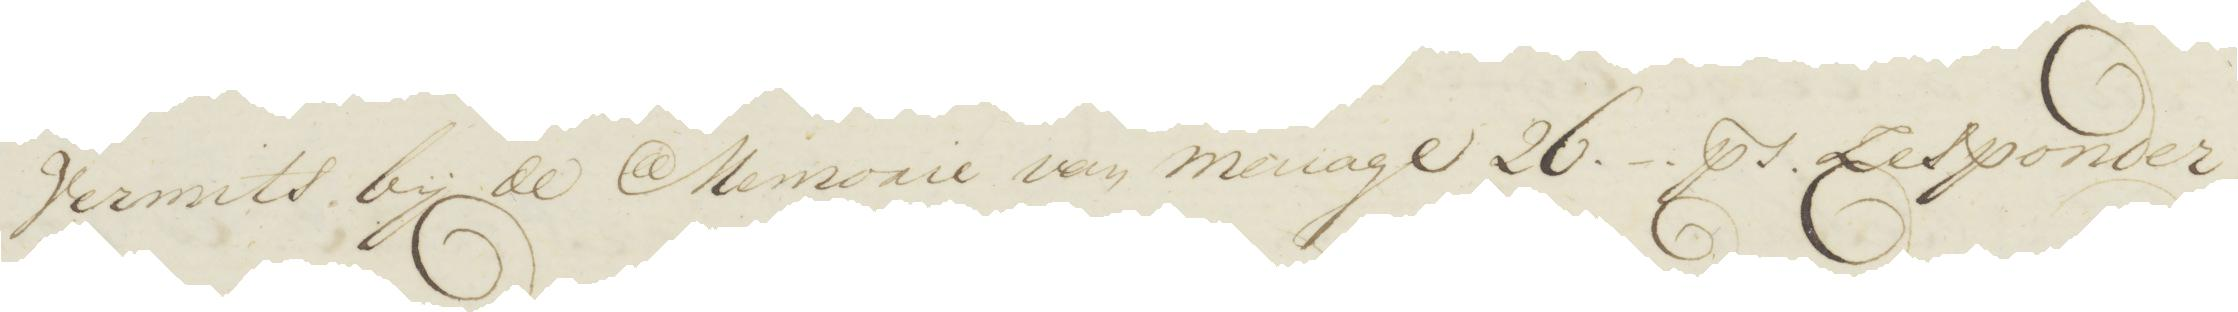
Vermits bij de Memorie van menage 26.–. ps. zes ponder
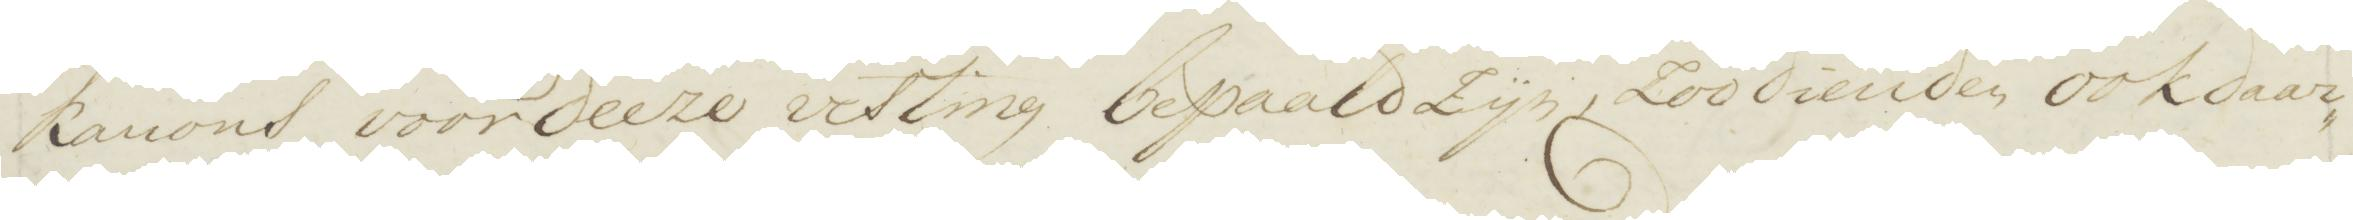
kanons voor deeze vesting bepaald zijn, zoo dienden ook daar„
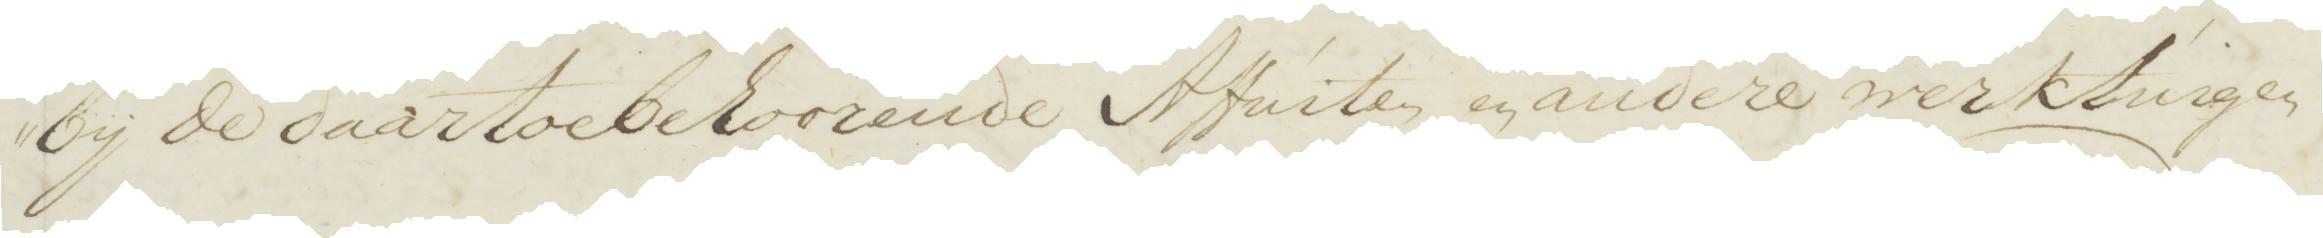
„bij de daartoebehoorende Affuiten en andere werktuigen
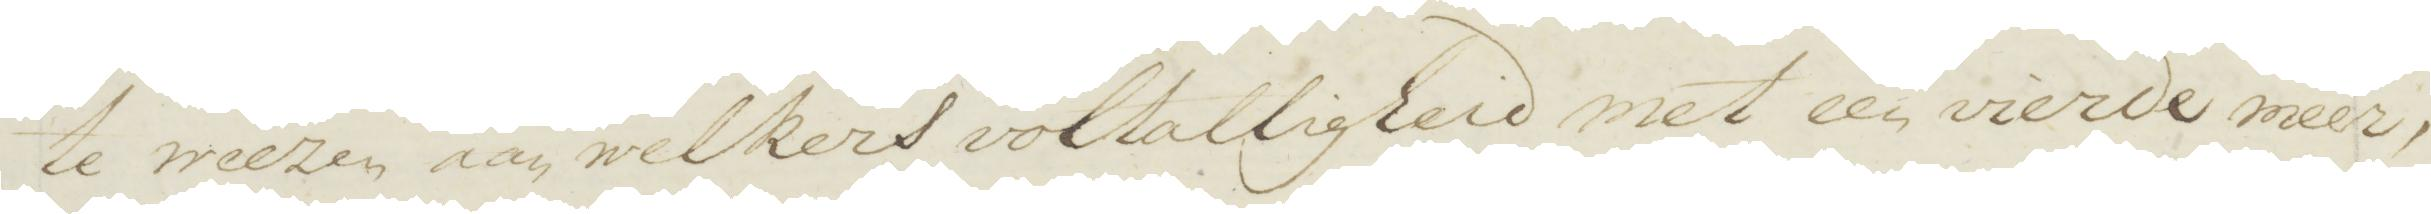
te weezen aan welkers voltalligheid met een vierde meer,
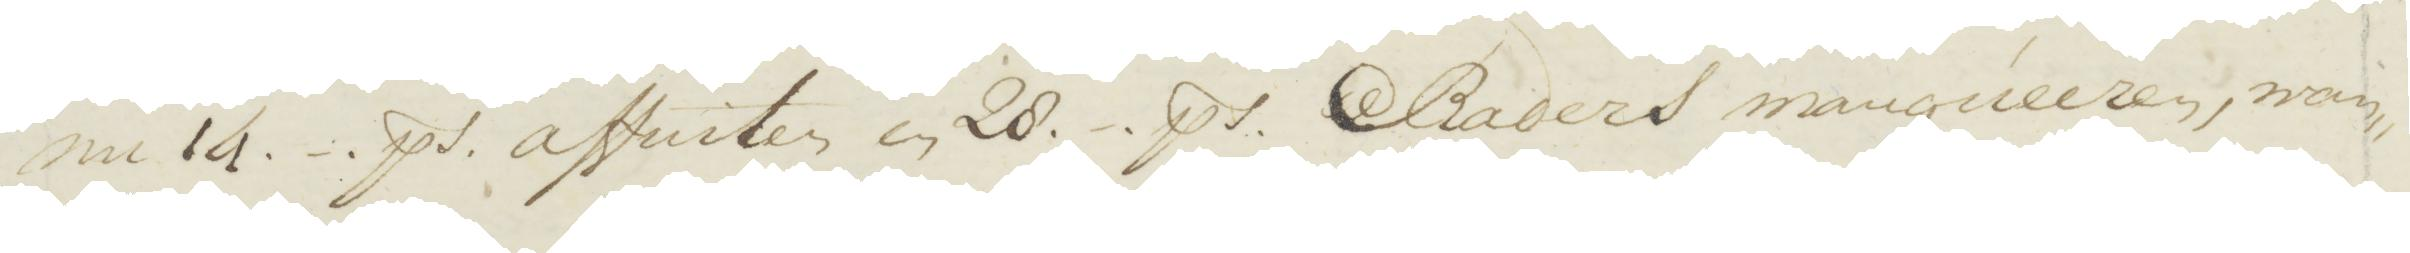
nu 14.–. ps. affuiten en 28.–. ps. Raders manqueeren, wan„
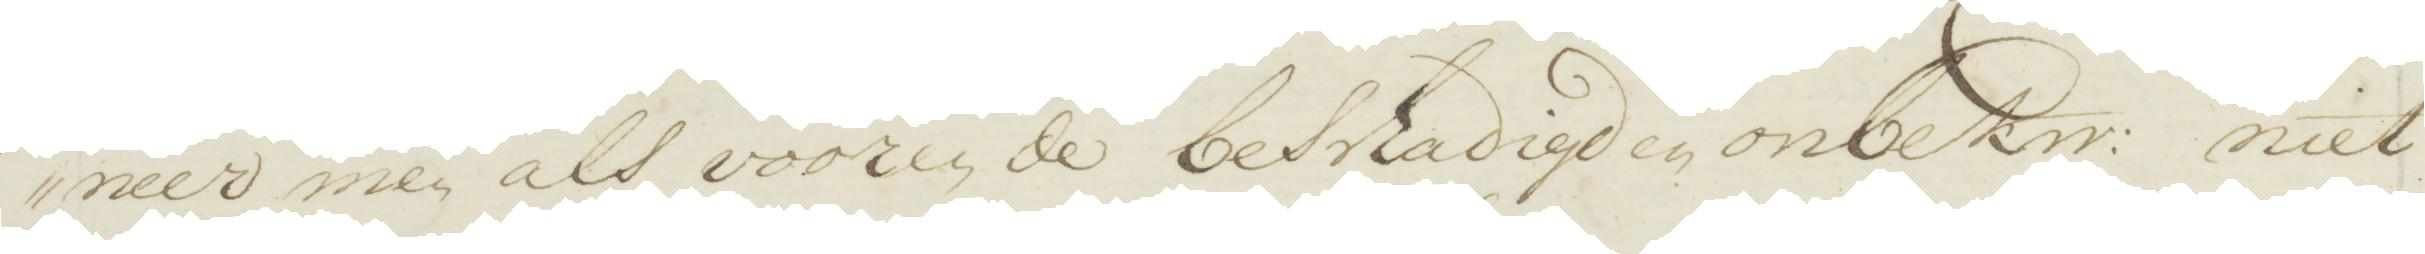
„neer men als vooren de beschadigden onbekw: niet
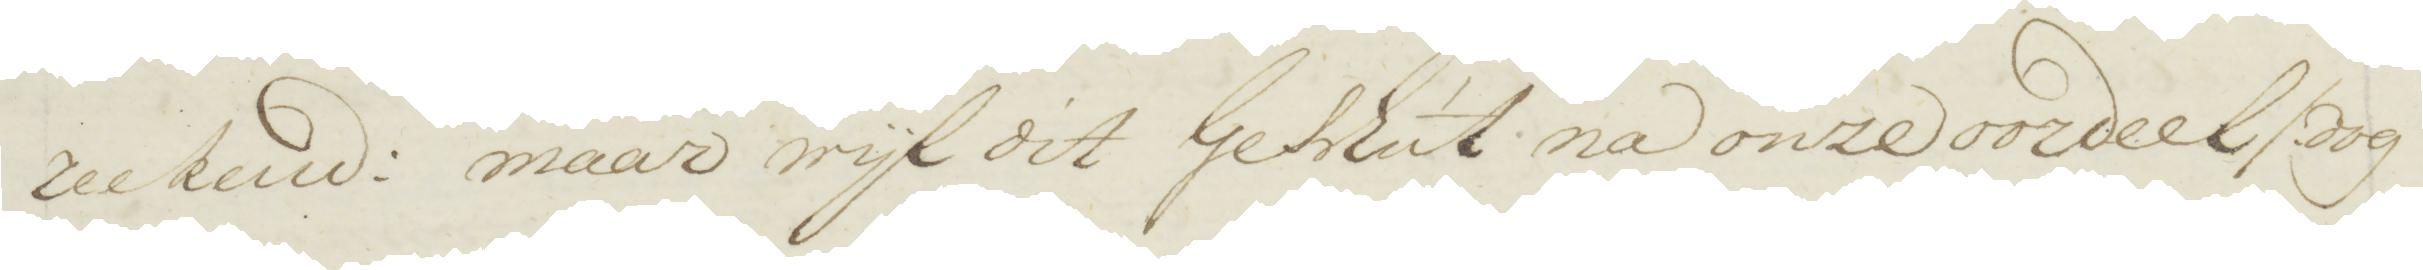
reekend: maar wijl dit Geschut na onze oordeel / .dog
